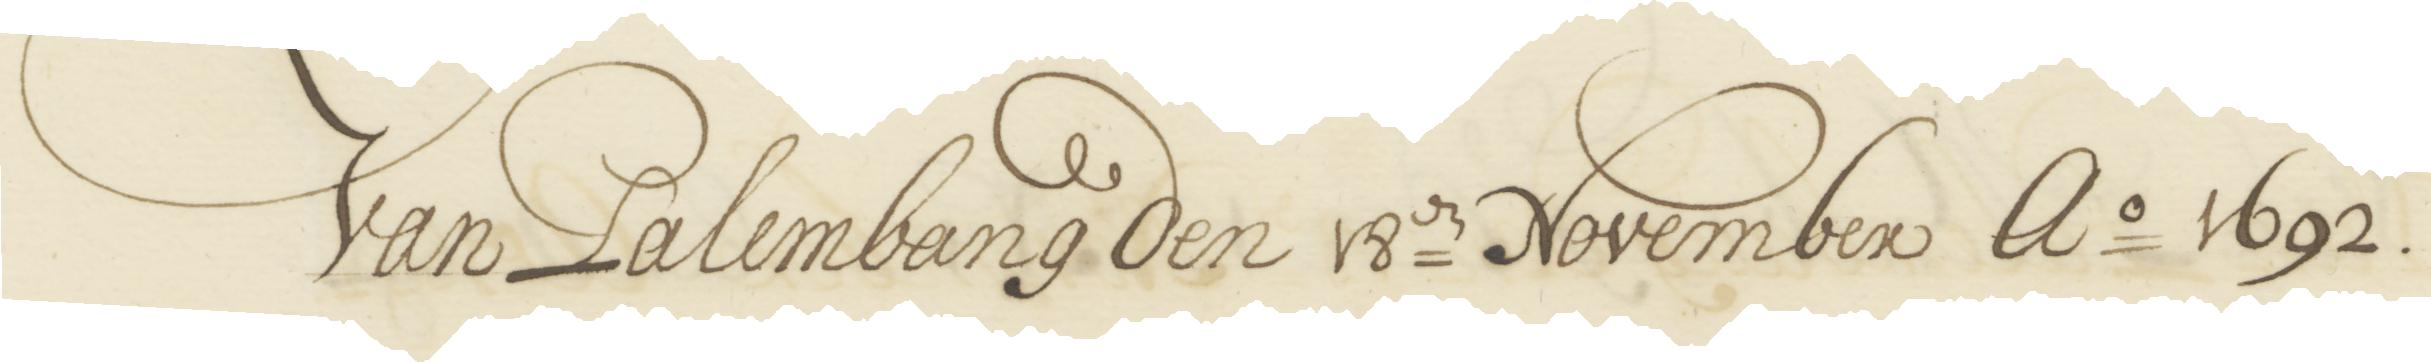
Van Palembang den 18=en November A=o 1692.
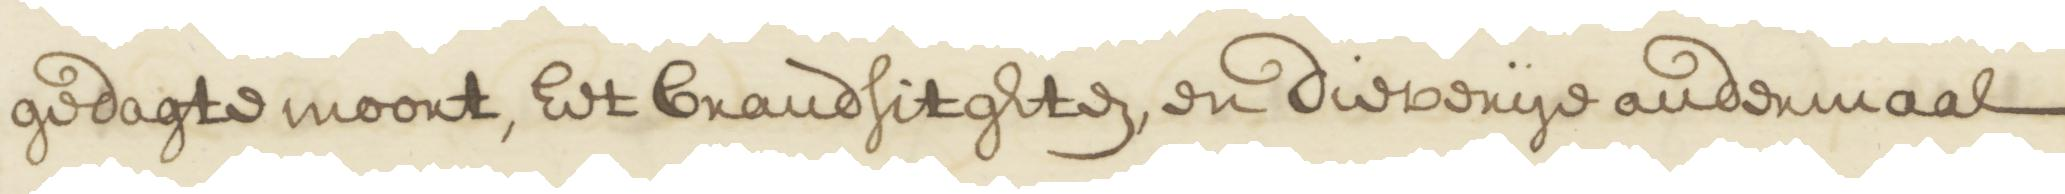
gedagte moort, het brandsitghten, en dieverije andermaal
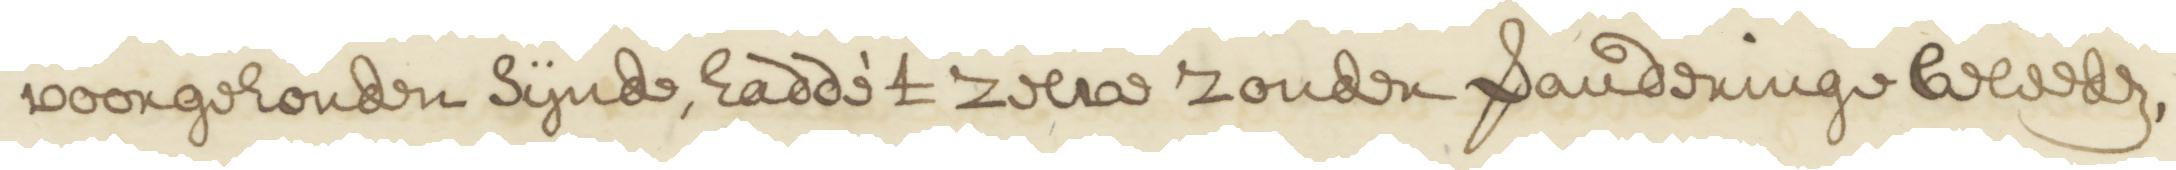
voorgehouden sijnde, hadde ’t zelve zonder veranderinge beleeden,
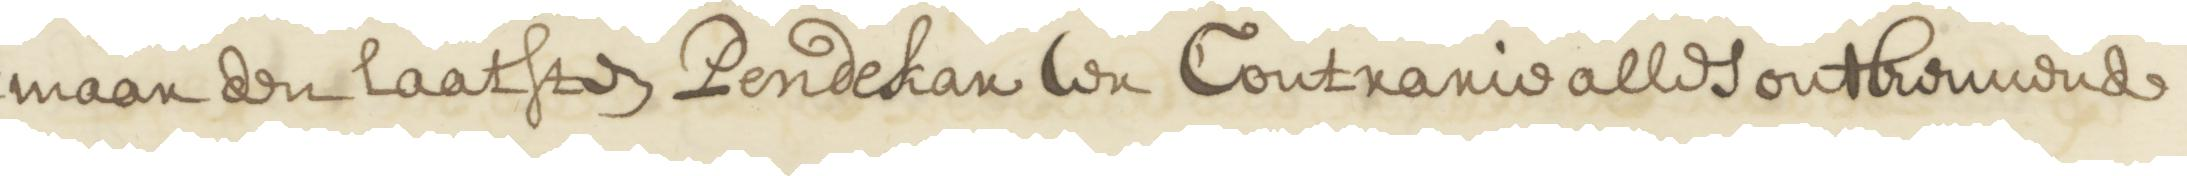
maar den laatsten Pendekar ter Contrarie alles ontkennende
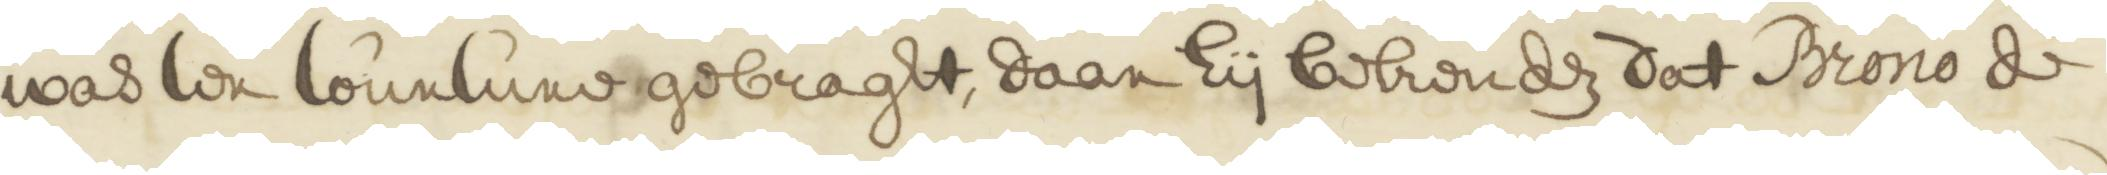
was ter tourture gebraght, daar hij bekenden dat Brono de
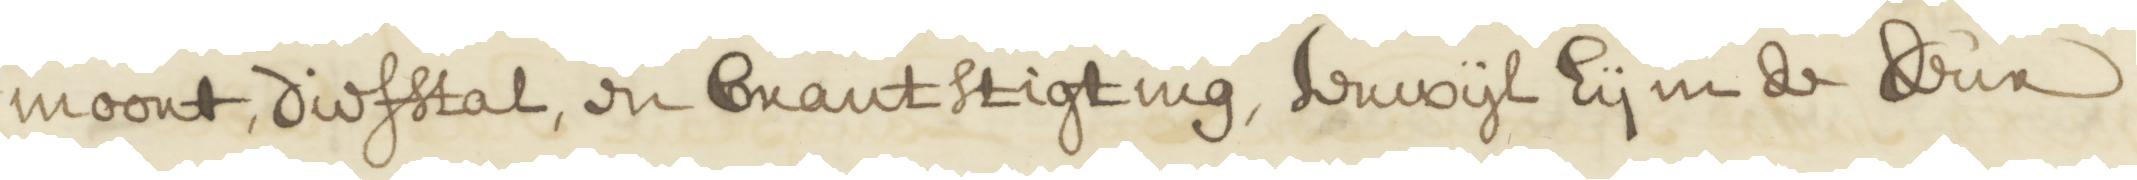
moort, diefstal, en brantstigting, terwijl hij in de deur
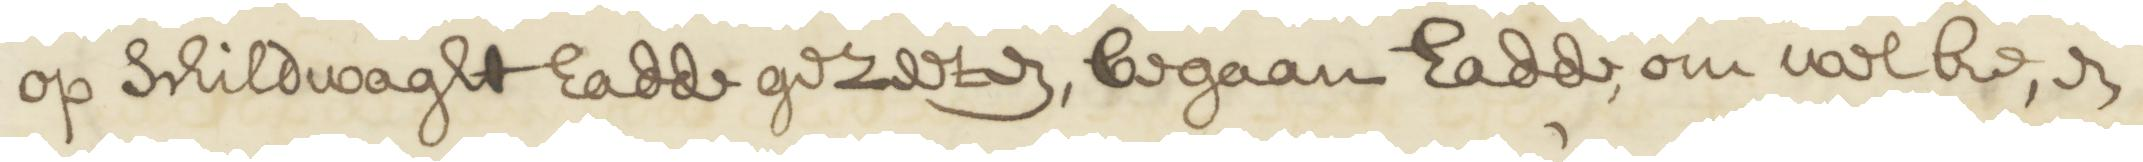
op schildwaght hadde gezeeten, begaan hadde, om welke, en
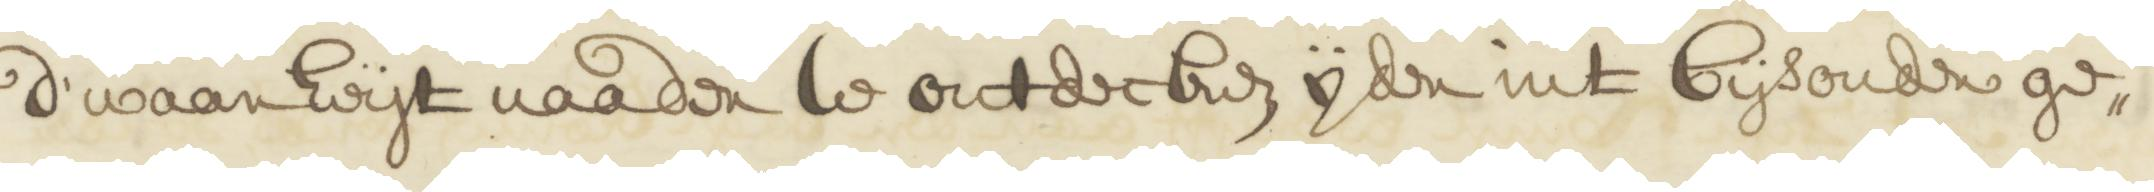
d’waarheijt naader te ontdecken ijder in't bijsonder ge„
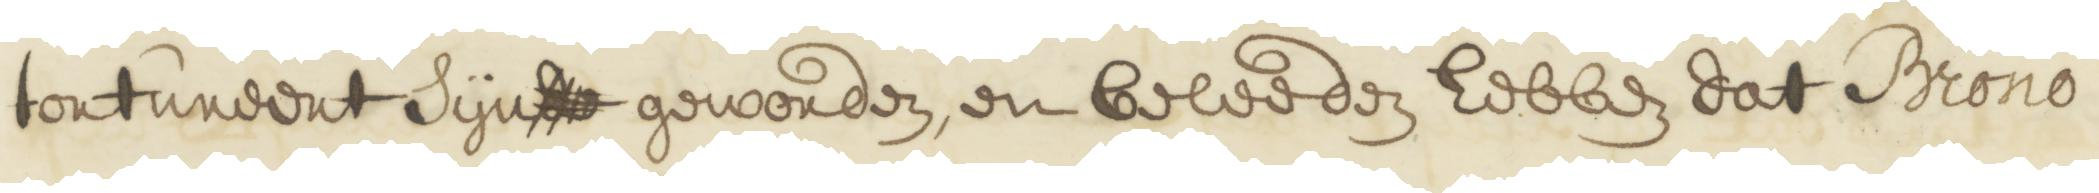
tortureert sijnde geworden, en beleeden hebben dat Brono
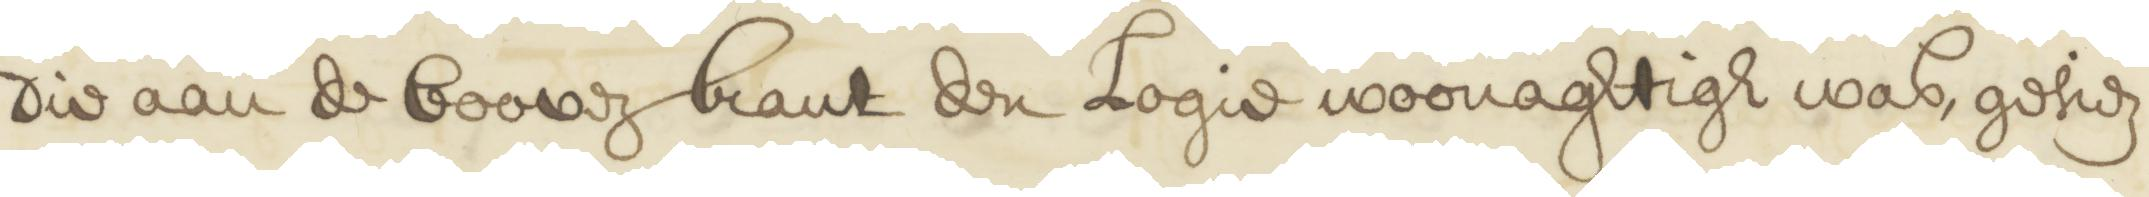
die aan de boovenkant der Logie woonaghtigh was, gesien
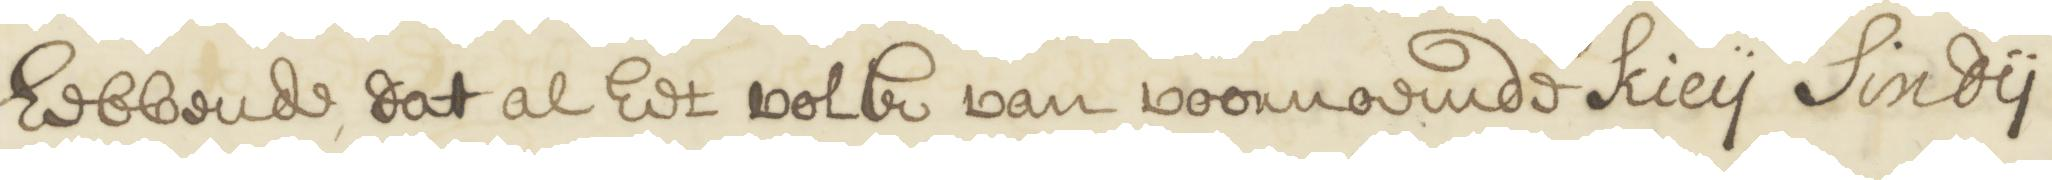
hebbende, dat al het volk van voornoemde kieij sindij
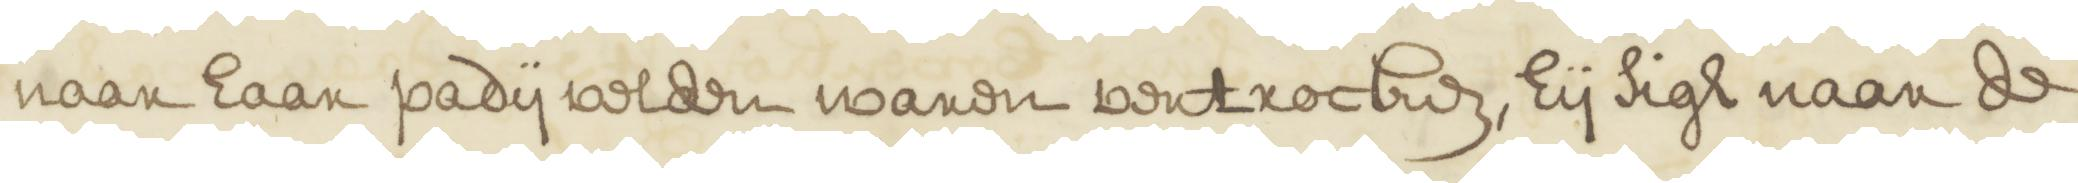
naar haar padij velden waren vertrocken, hij sigh naar de
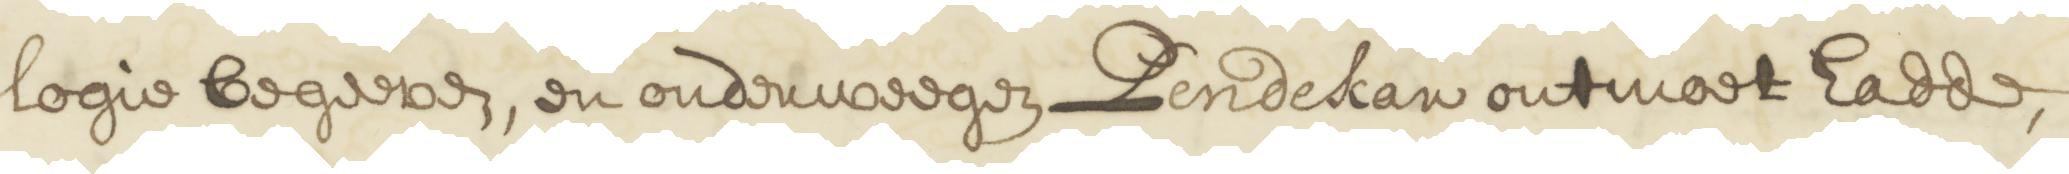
logie begeeven, en onderweegen Pendekar ontmoet hadde,
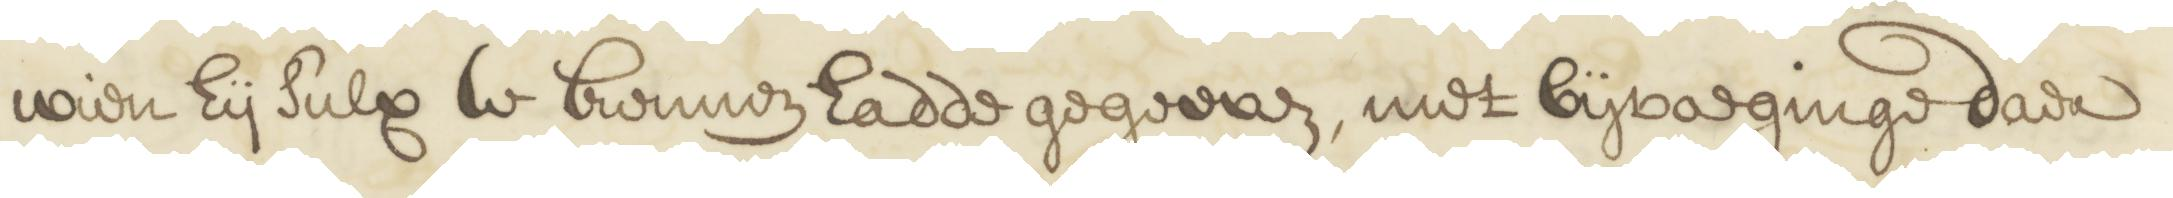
wien hij sulx te kennen hadde gegeeven, met bijvoeginge daer
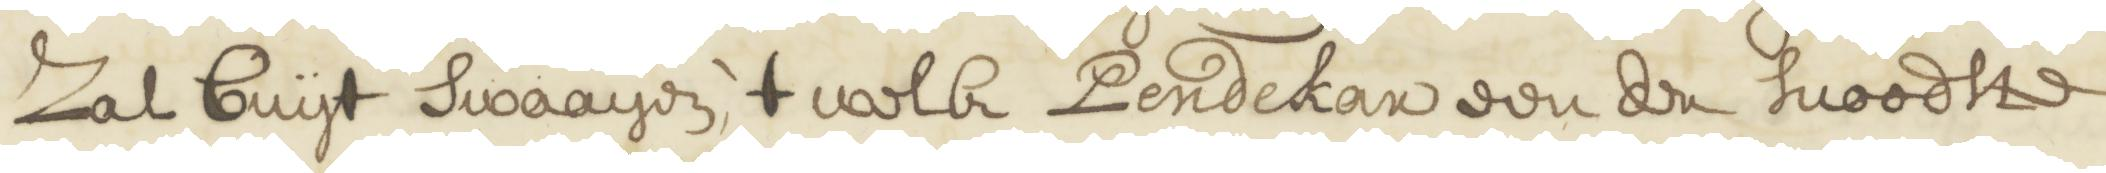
zal buijt swaaijen, ’t welk Pendekar een der snoodste
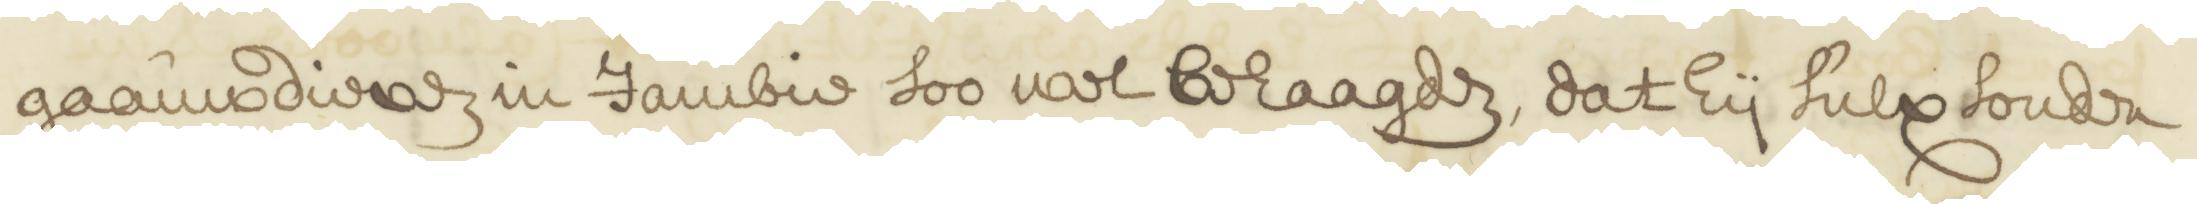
gaauw dieven in Iambie soo wel behaagden, dat hij sulx sonder
